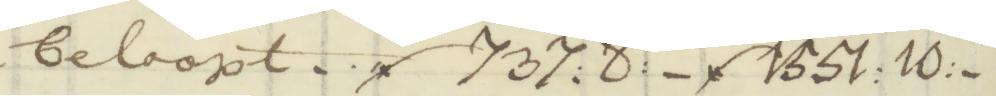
beloopt - . ƒ 737:8: – ƒ1551: 10: –
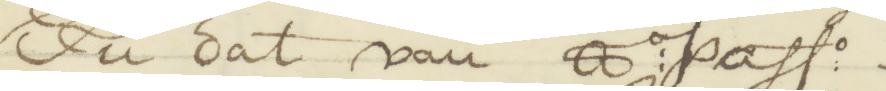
En dat van a:o pass:o
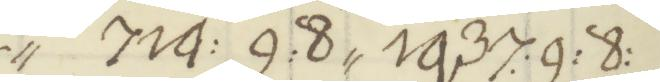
„ 714: 9: 8 „ 1437: 9: 8:
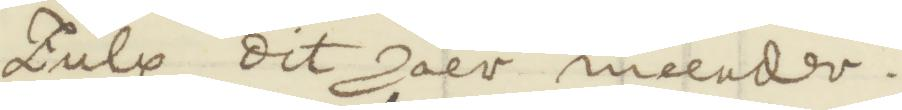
zulx dit jaer meerder
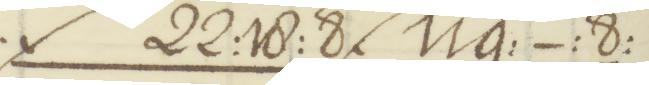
ƒ 22:18:8 ƒ114:–:8:
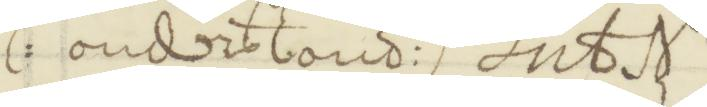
(:onderstond:) In't N:ds
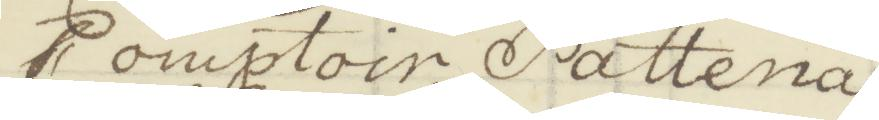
Comptoir Pattena
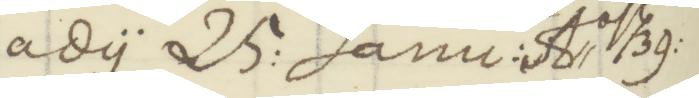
adij 25: Janu: A„o 1739:
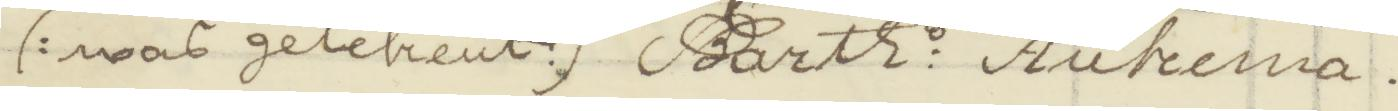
(:was getekent:) Barth:s Aukema.
